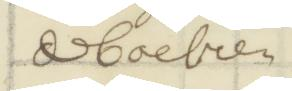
deboeken
